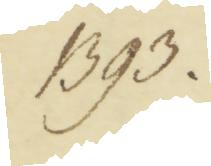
1393.
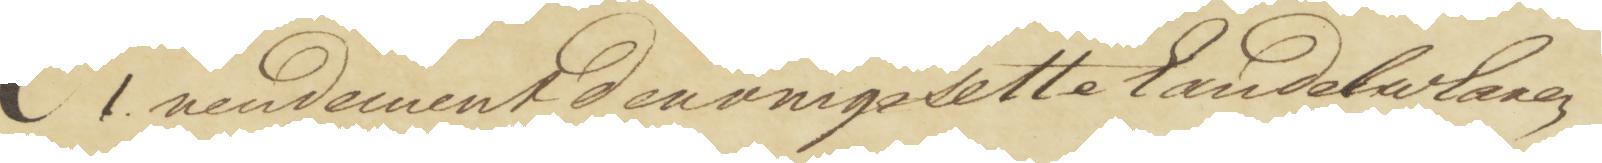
1. rendement der omgesette handelwharen
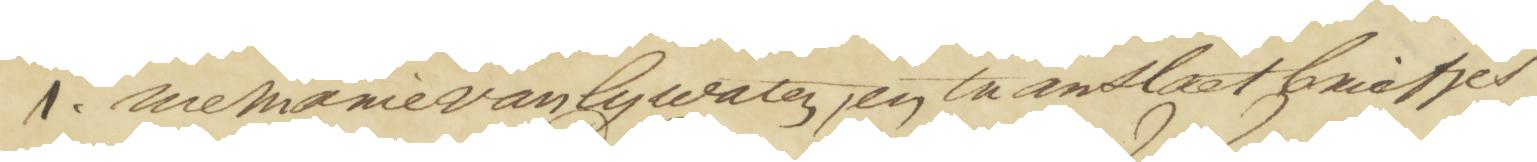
1. memorie van lywaten, en translaetbriefjes
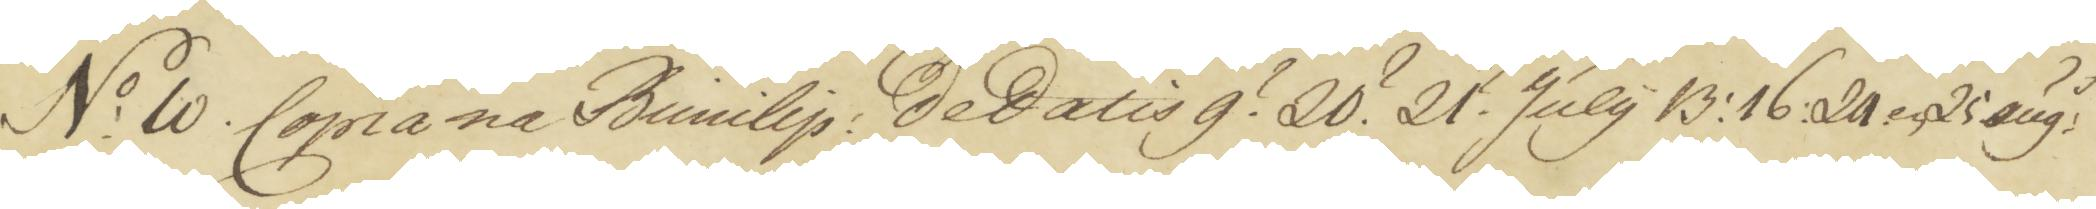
N:o 10. Copia na Bimilip: de datis 9.' 20.' 21.' Julij 13: 16: 24: en 25 aug:s
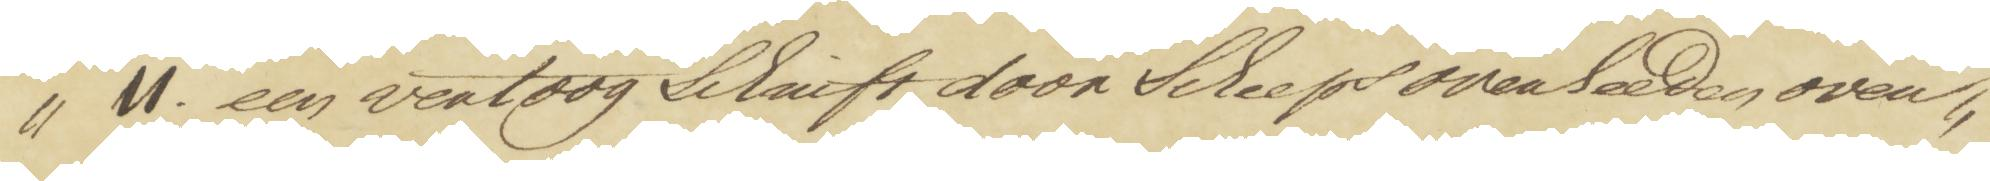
„ 11. een vertoog schrift door scheepsoverheeden over„
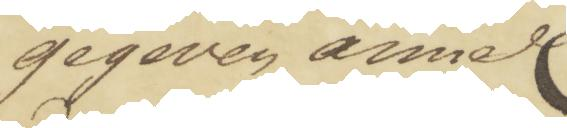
gegeven annex
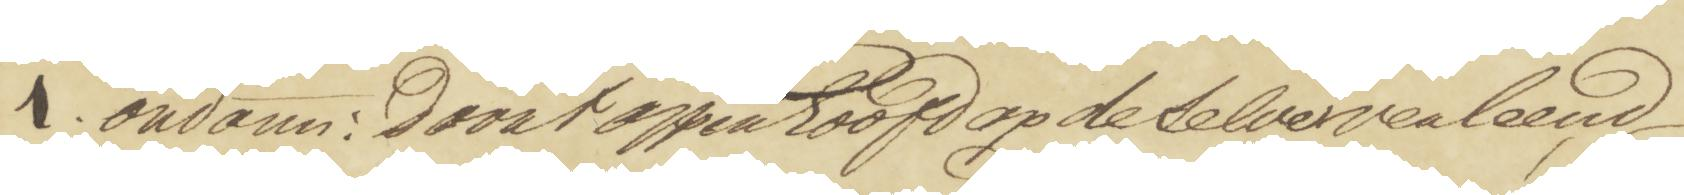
1. ordonn: door 't opperhoofd op deselve verleend
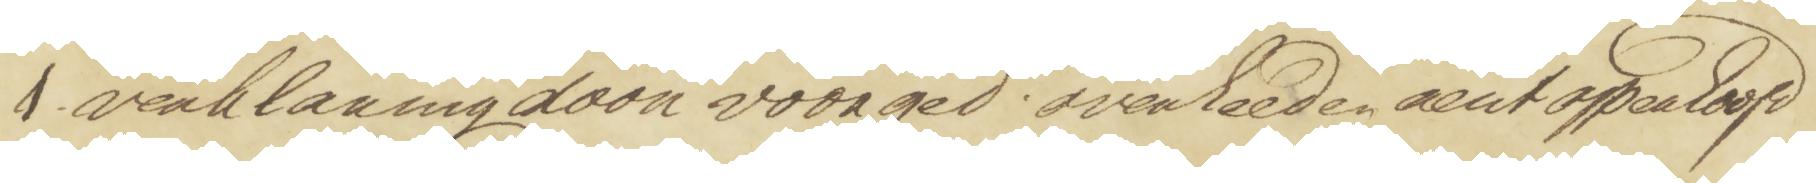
1. verklaring door voor ged. overheeden aen't opperhoofd
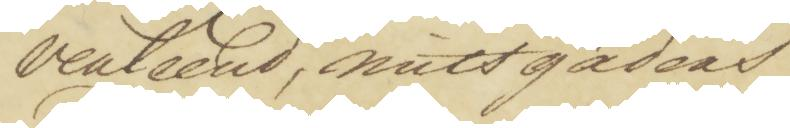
verleend, mitsgaders
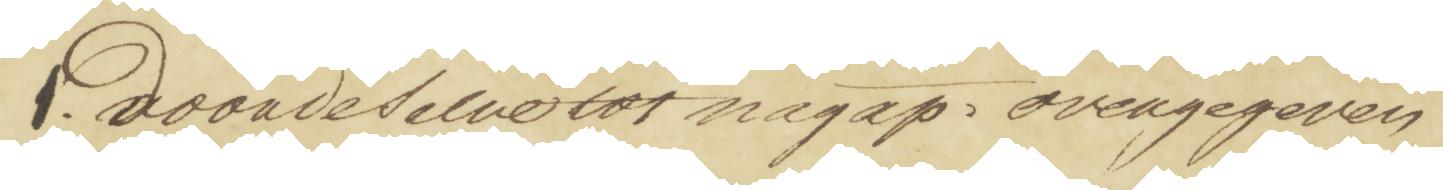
1. door deselve tot nagap: overgegeven
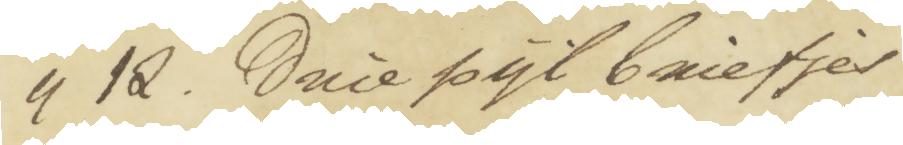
„ 12. drie pijl briefjes
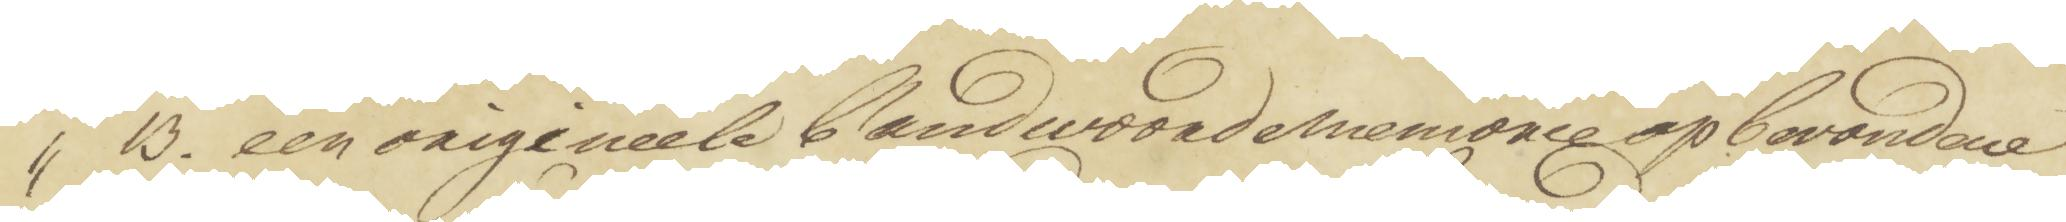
„ 13. een origineele b'andwoorde memorie op bevondene
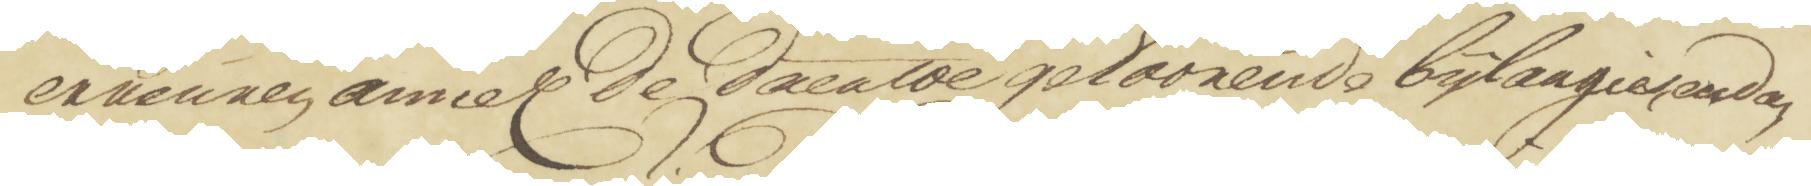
erreuren annex de daer toe gehoorende bijlaagies, en dan
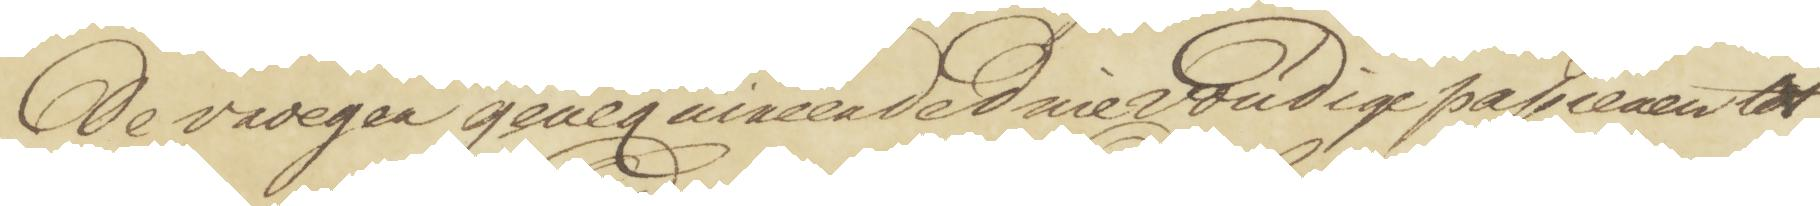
de vroeger gerequireerde drie voudige papieren tot
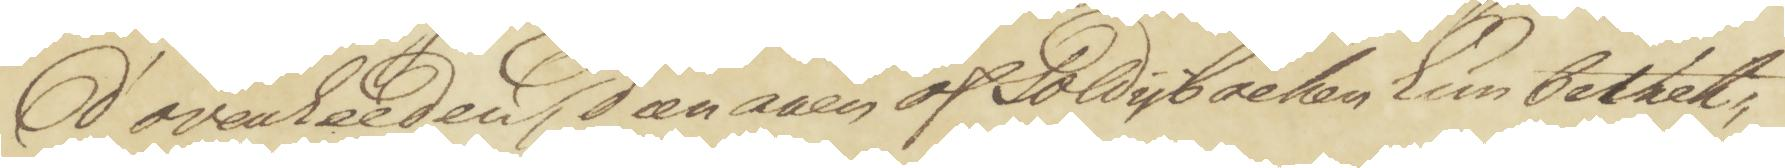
d'overheeden, dienaren of soldijboeken hun betrek„
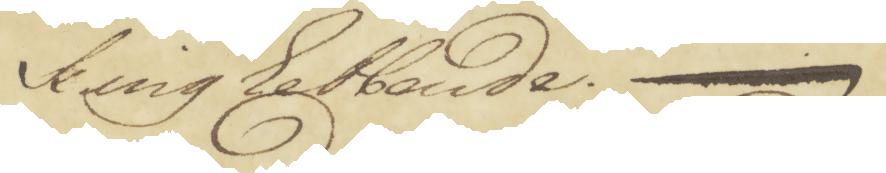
king hebbende. —
